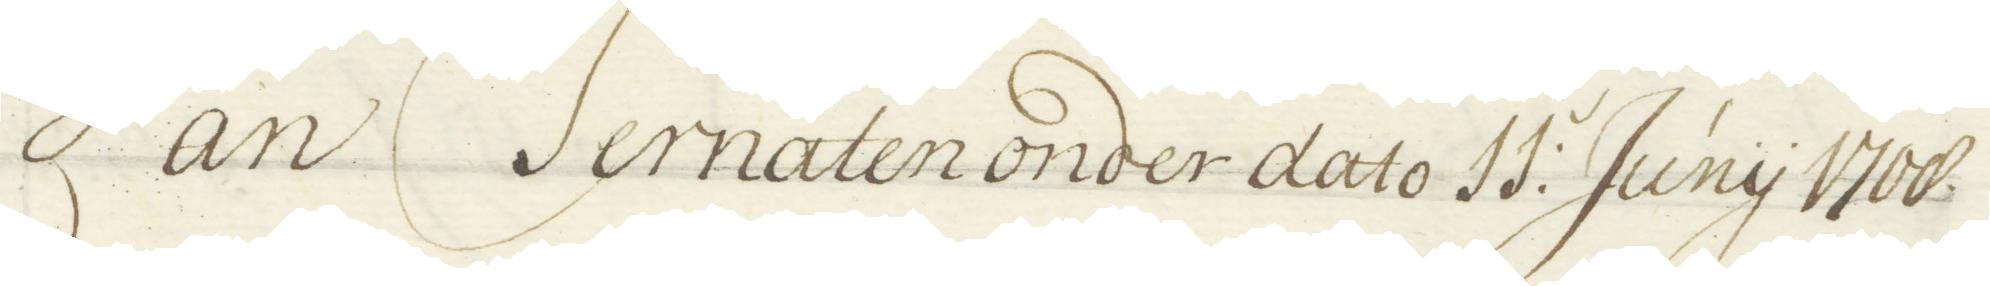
Van Ternaten onder dato 11:' Junij 1708.
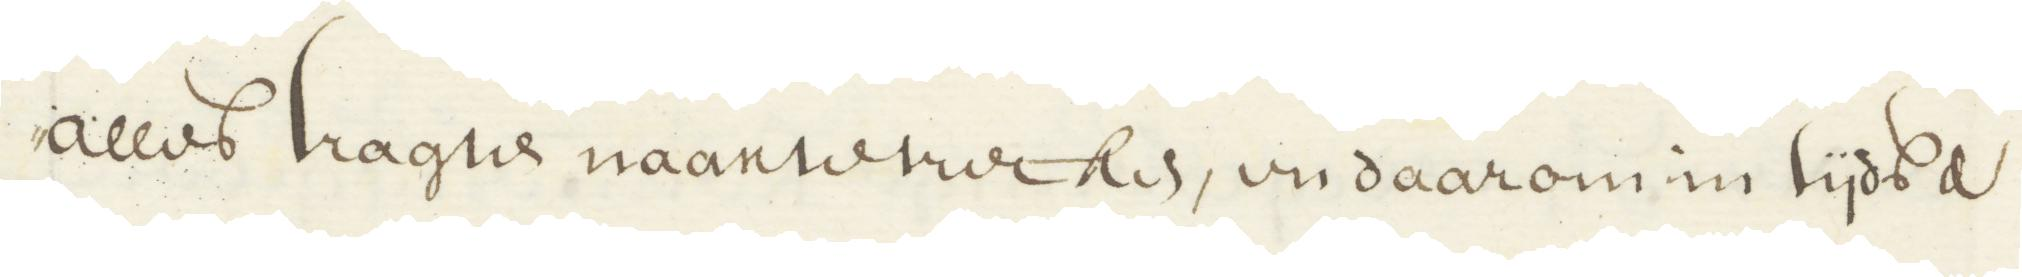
alles tragten naar te trecken, en daar om in tijds de
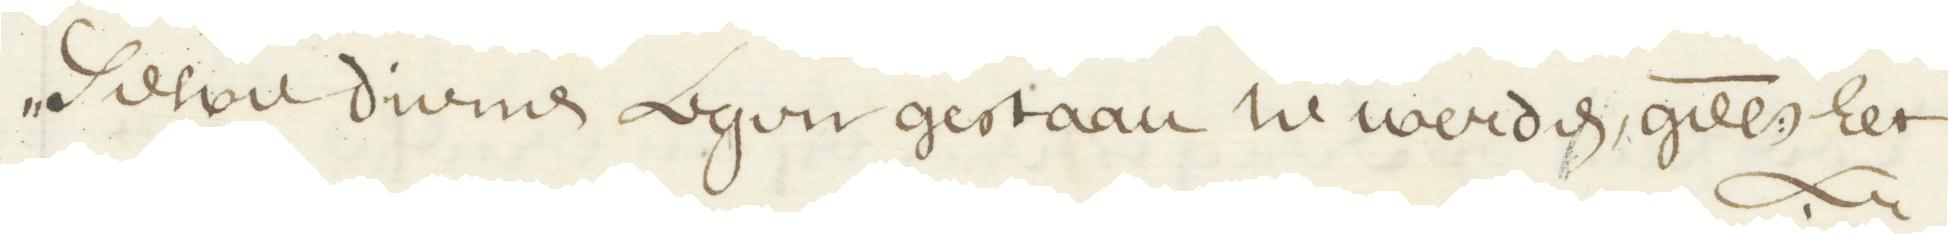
„selve dienen tegen gestaan te werden, gelijk het
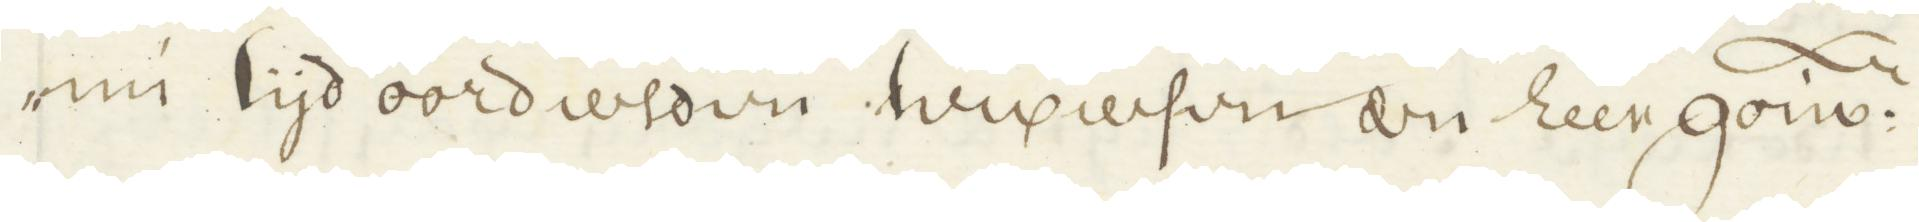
„nu tijd oordeelden teweesen den heer gouv:r
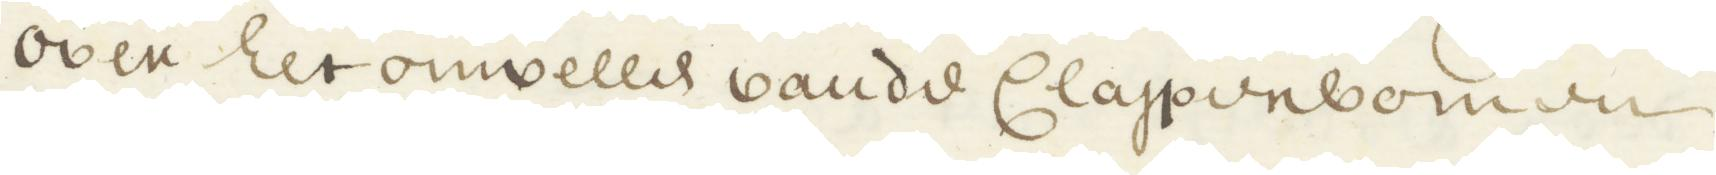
over het omvellen van de Clapperbomen
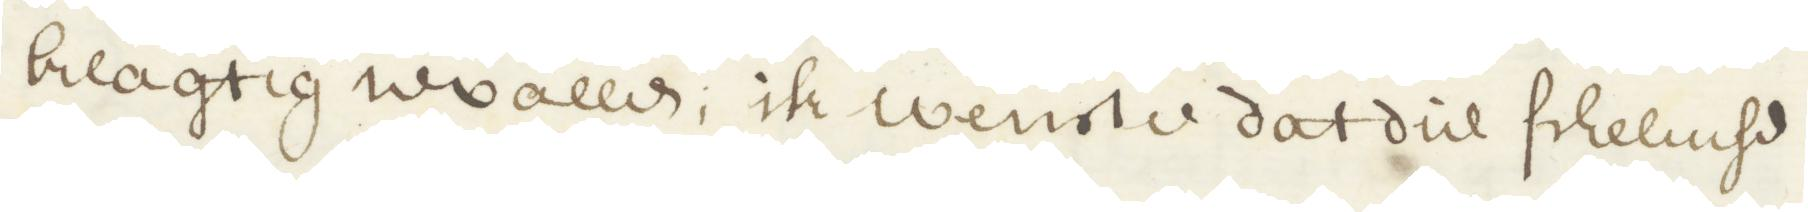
klagtig tevallen; ik wenste dat die schelmse
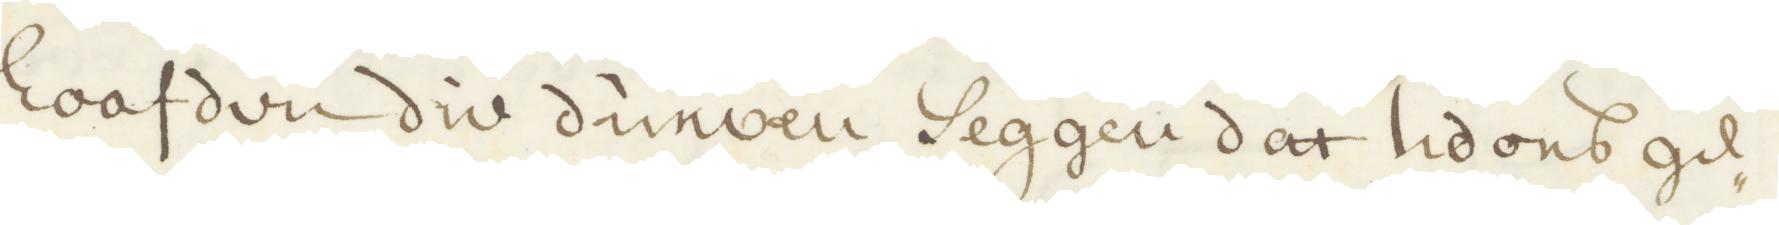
hoofden die durven seggen dat tidors ge„
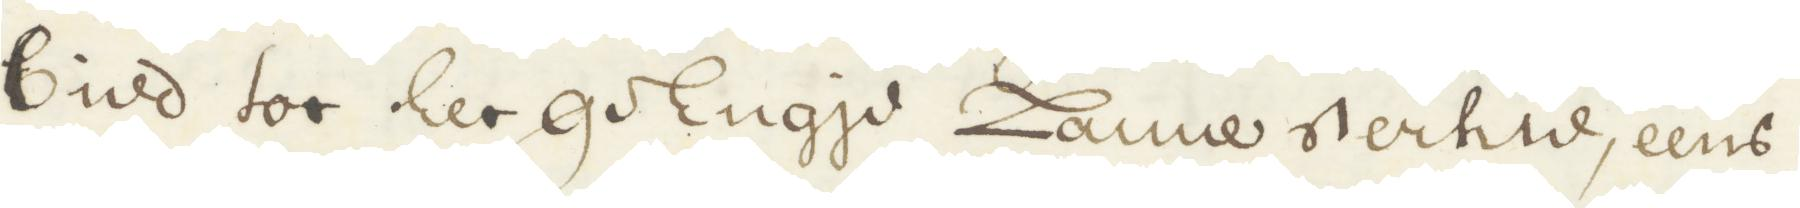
bied tot het gehugje Zame sterkte, eens
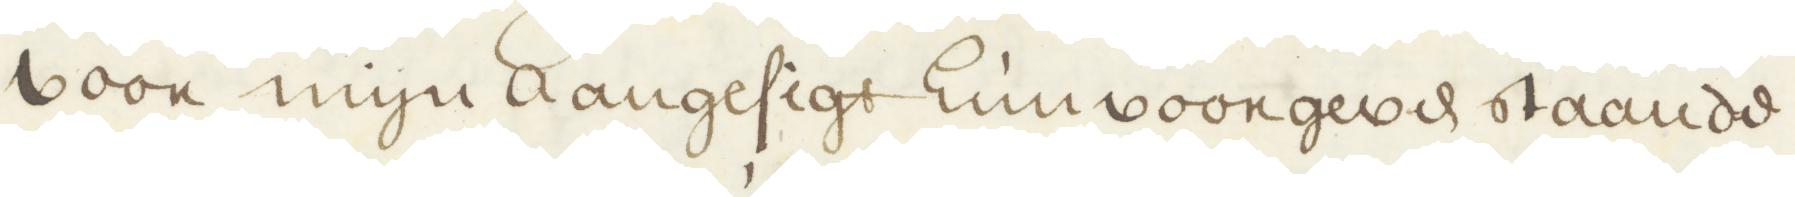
voor mijn aangesigt hun voorgeven staande
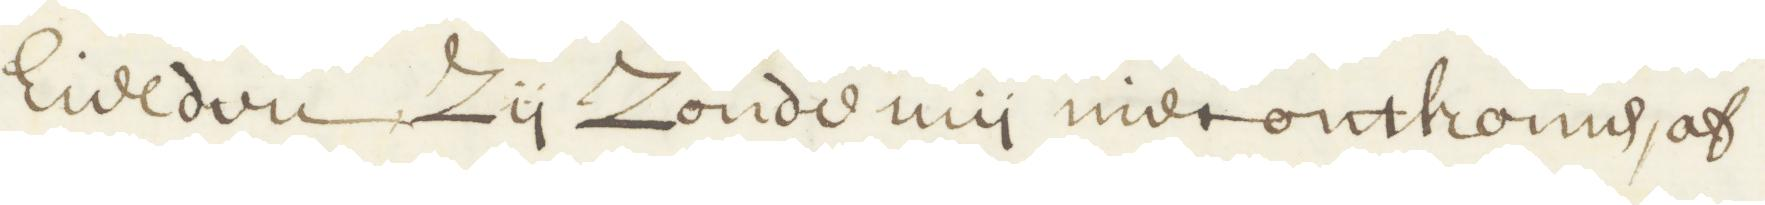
hielden zij zoude mij niet ontkomen, of
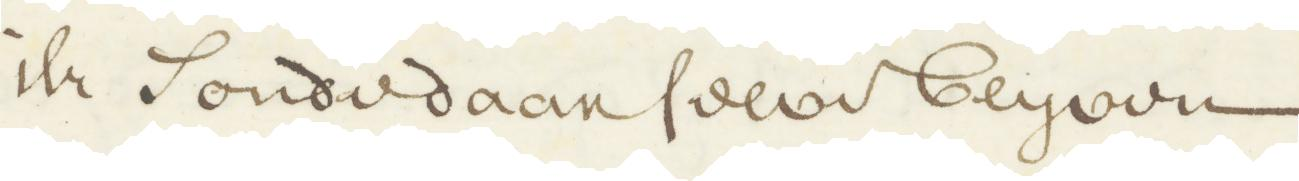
ik soude daar selve blijven
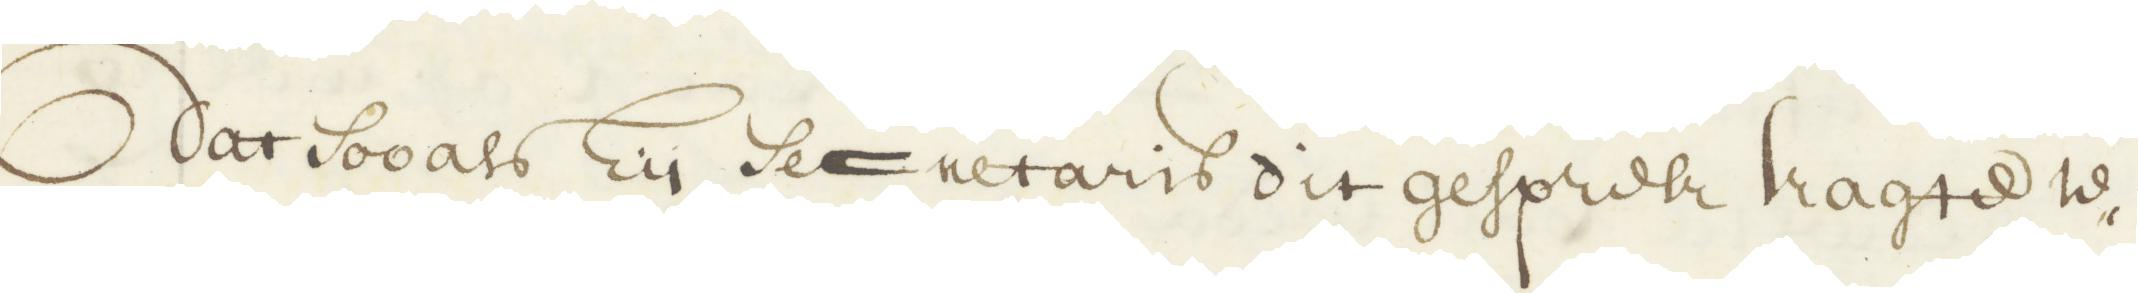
dat soo als hij secretaris dit gesprek kagte te„
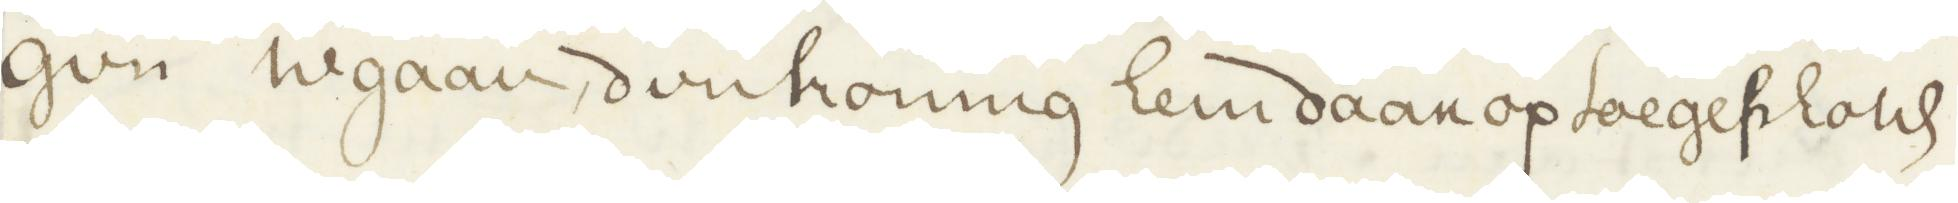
gen te gaan, den koning hem daar op toegeschoten
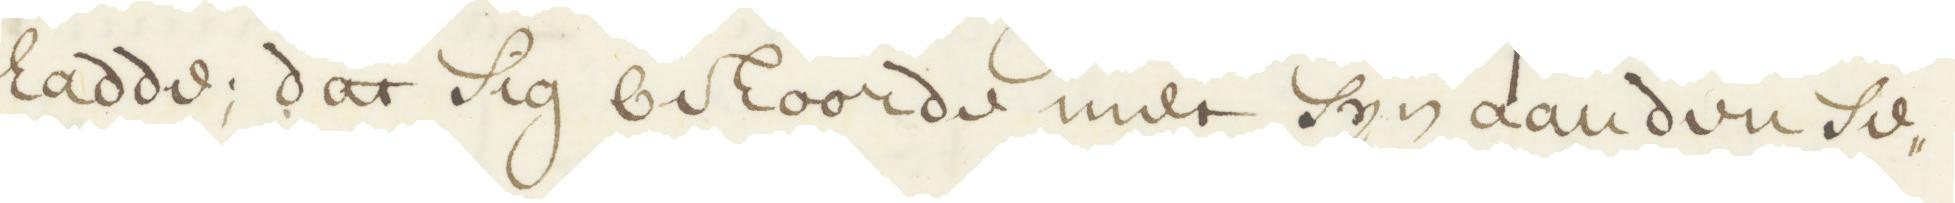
hadde; dat sig behoorde met syn aan den se„
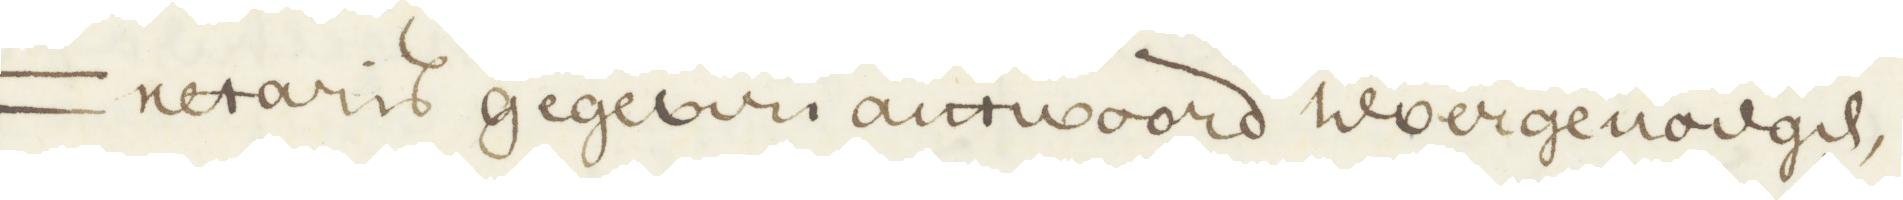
cretaris gegeven antwoord tevergenoegen,
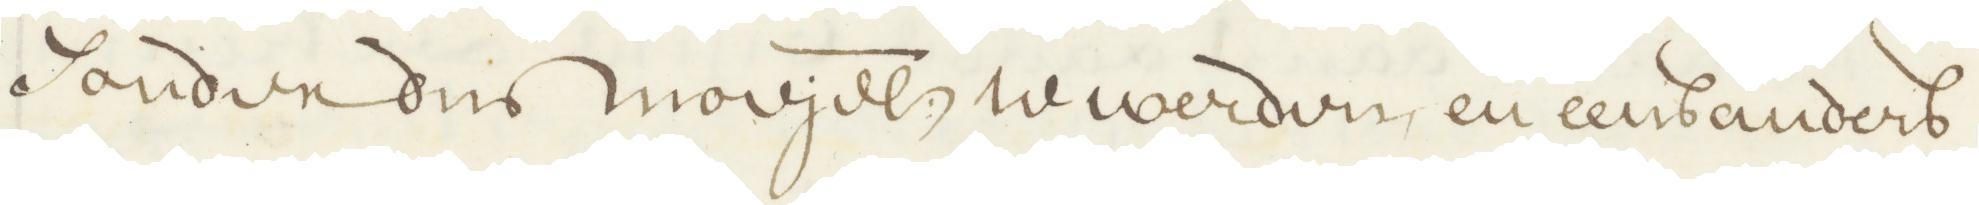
sonder dus moejelijk te werden, en eensanders
